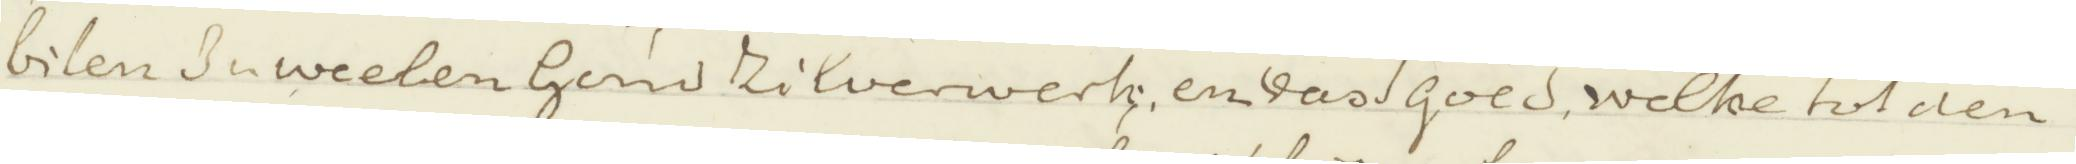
bilen Iuweelen Goud Zilverwerk, en vast Goed, welke tot den
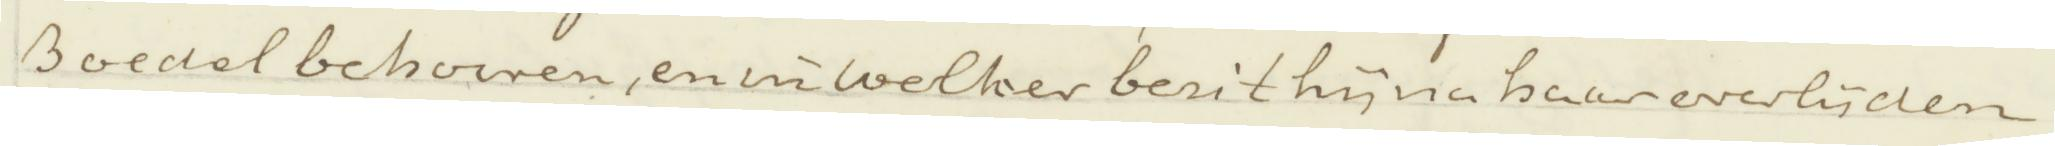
Boedel behooren, en in welker bezit hij na haar overlijden
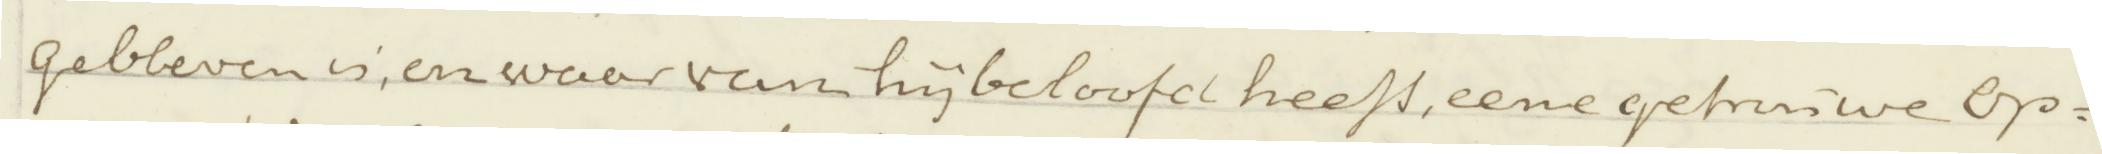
Gebleven is, en waarvan hij beloofd heeft, eene getrouwe Op=
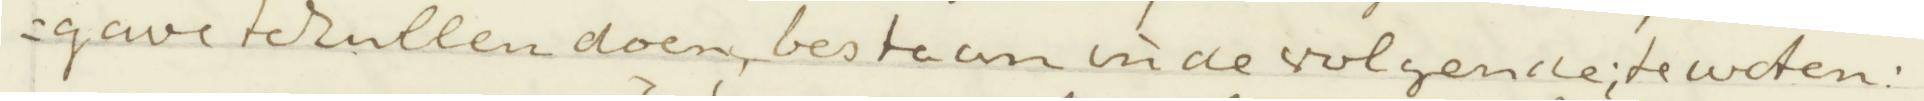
=gave te zullen doen, bestaan in de volgende; te weten:
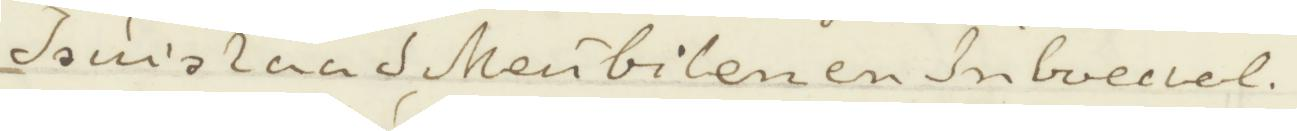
huisraad Meubilen en Inboedel.
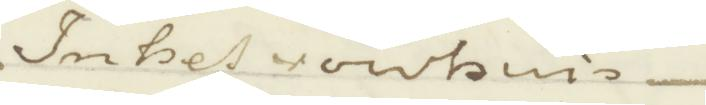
In het voorhuis
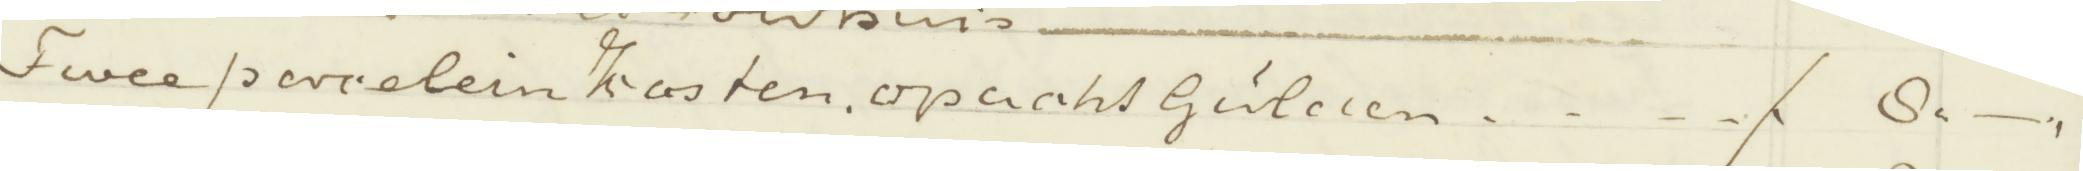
Twee porcelein kasten. op acht Gulden - - - - ƒ 8„ —„
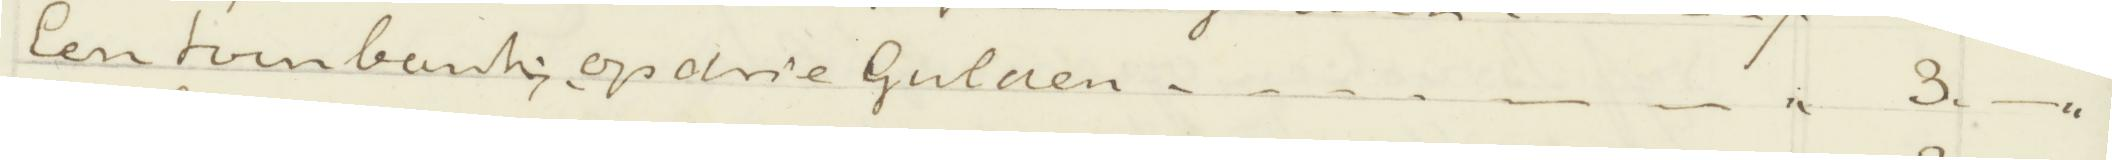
Een toonbank op drie Gulden – – – - - - - – „ 3„ —„
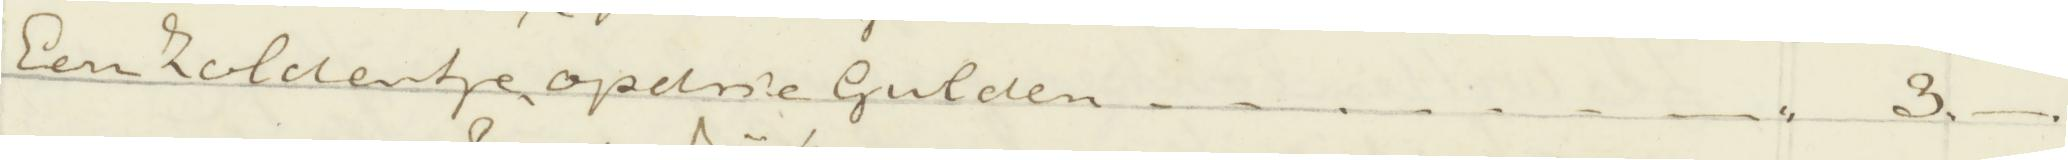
Een zoldertje op drie Gulden – – - - - – – – „ 3„ —
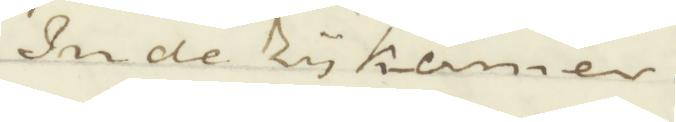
In de zijkamer
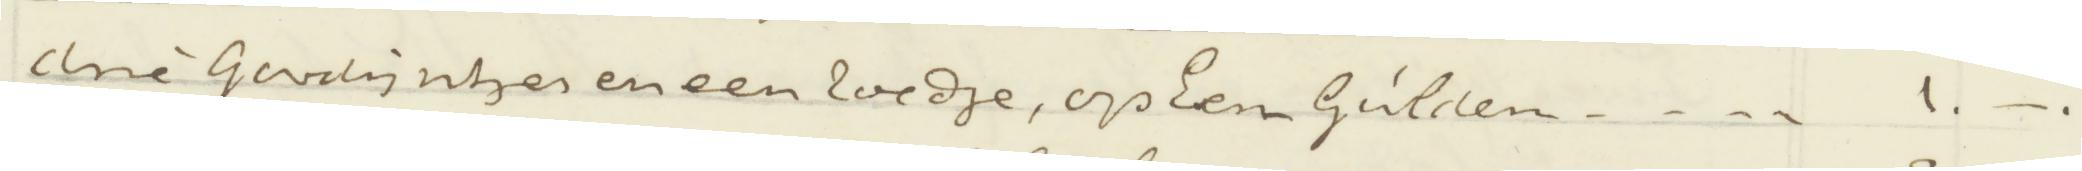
drie Gordijntjes en een roedje, op Een Gulden – – – „ 1. —.
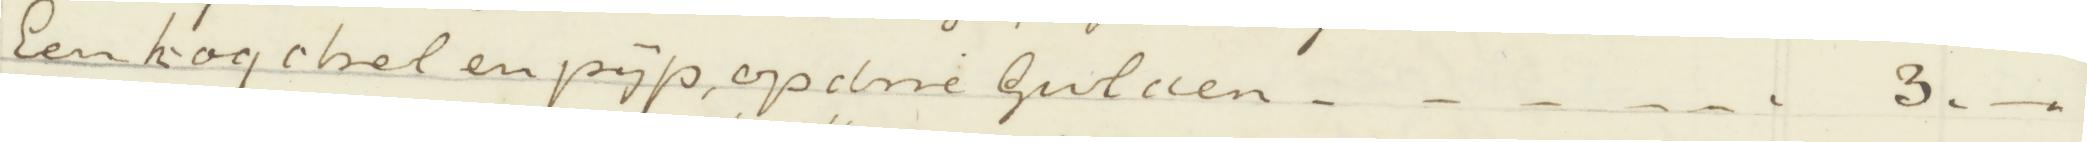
Een kogchel en pijp, op drie gulden – – – – – „ 3 „ —„
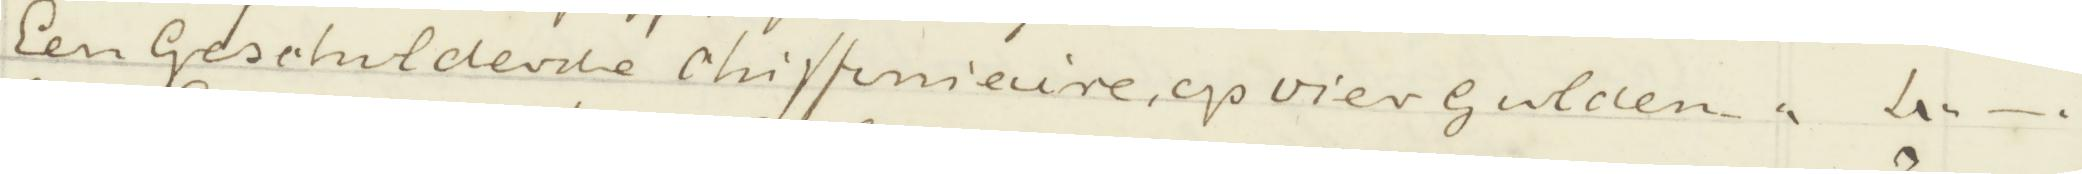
Een Geschilderde chiffonieure, op vier Gulden – „ 4„ —
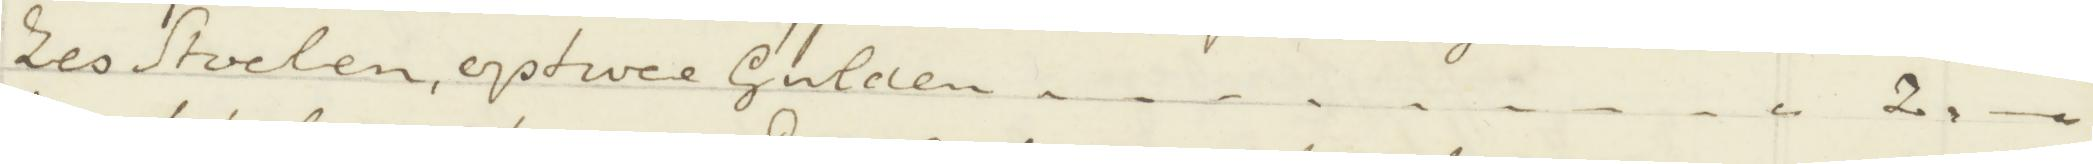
Zes stoelen, op twee Gulden – – – - - - – – „ 2 „ —
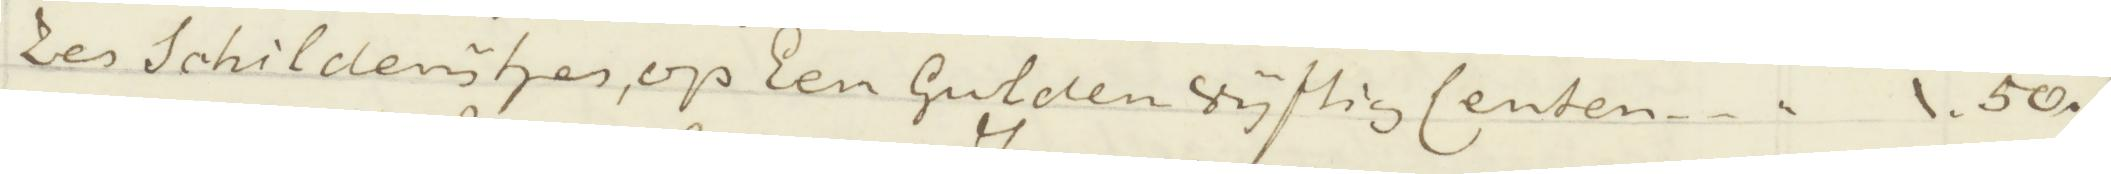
Zes schilderijtjes, op Een Gulden vijftig Centen – – „ 1. 50.
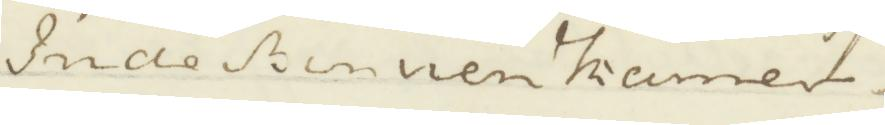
In de Binnen Kamer
